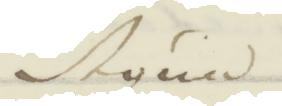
Aqua
